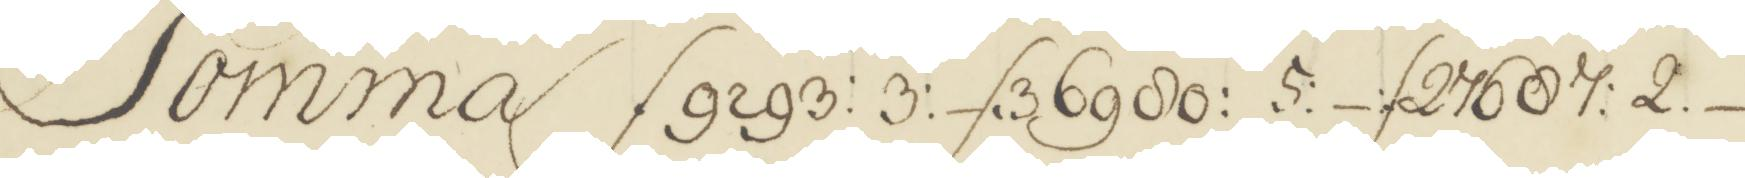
Somma ƒ9293:3: ƒ36980: 5:— ƒ 27687:2.—
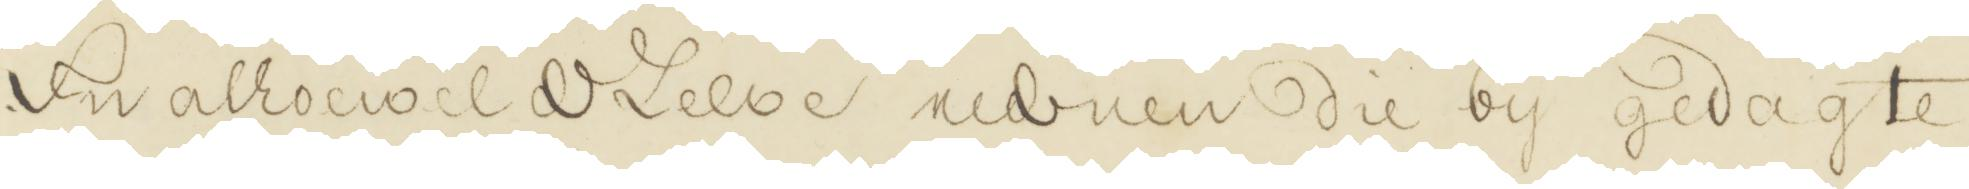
En alhoewel dezelve redenen die bij gedagte
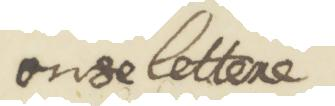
onse lettere
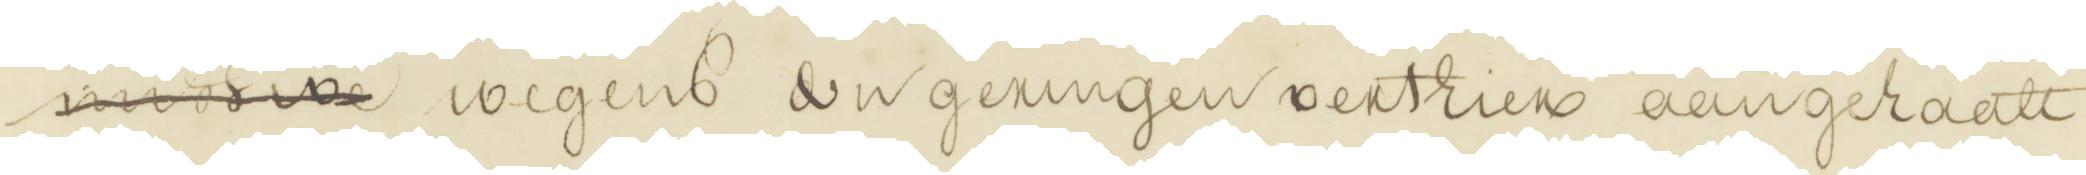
missive wegens den geringen verthier aangehaalt
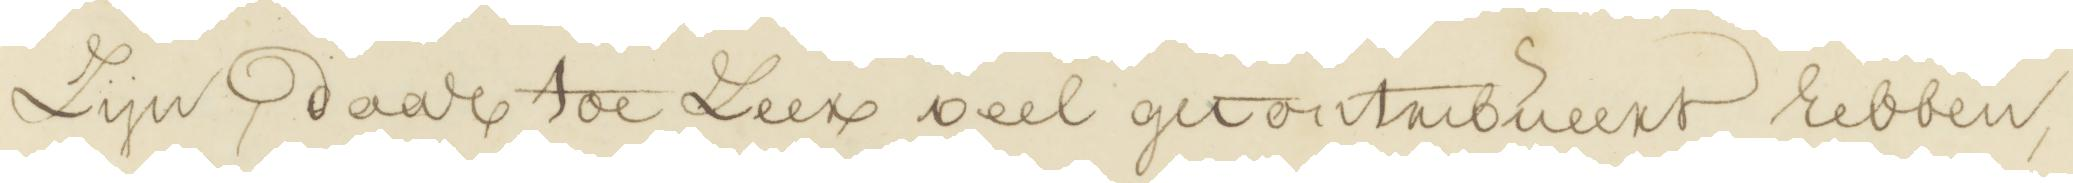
zijn, daar toe zeer veel gecontribueert hebben,
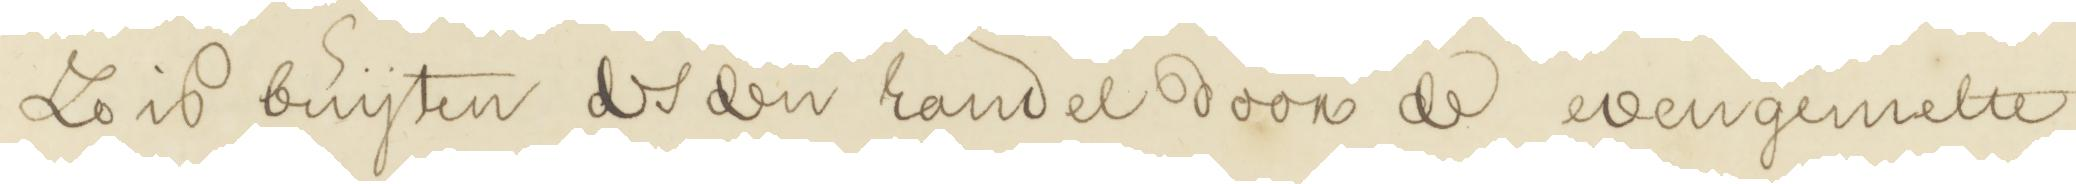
zo is buijten des den handel door de evengemelte
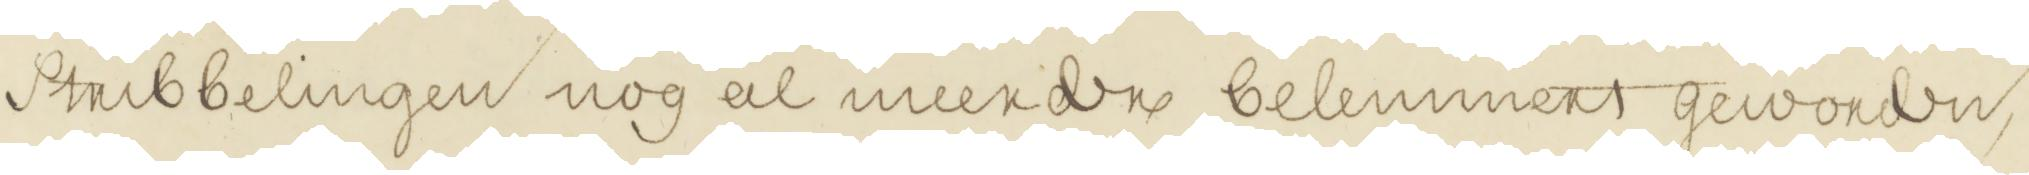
stribbelingen nog al meerder belemmert geworden,
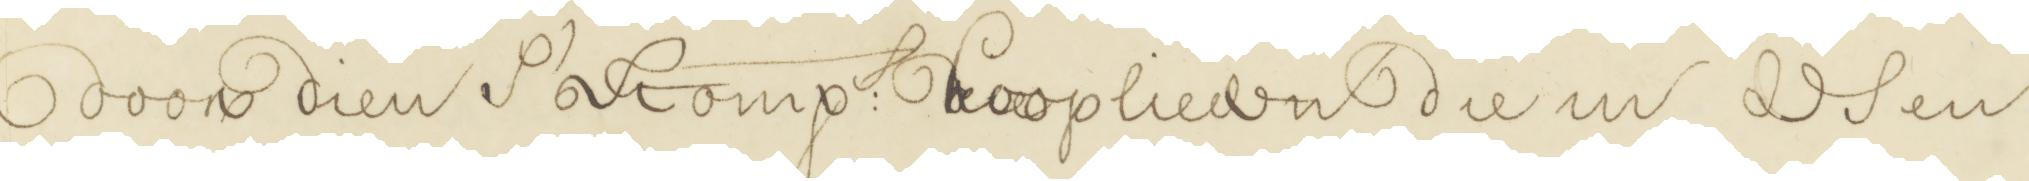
door dien s' Ecomp:s kooplieden die in desen
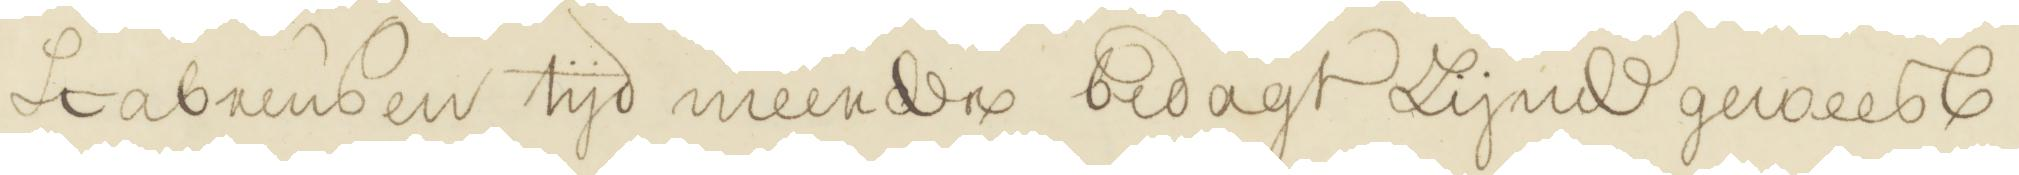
scabreusen tijd meerder bedagt zijnde geweest
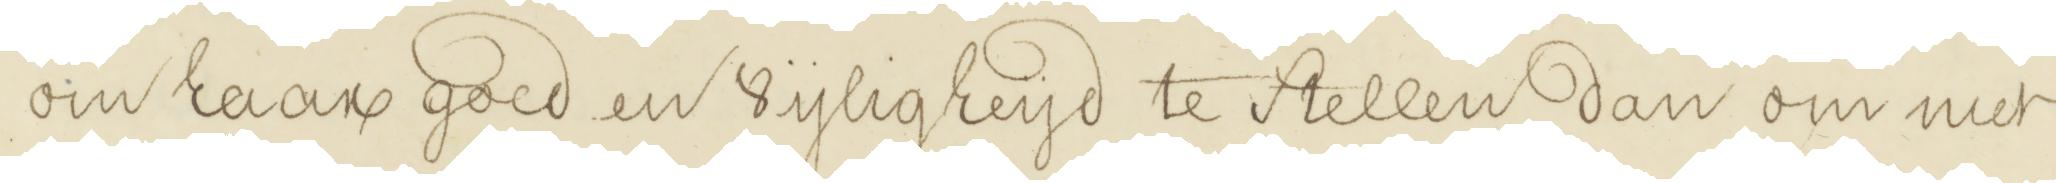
om haar goed en vijligheijd te stellen dan om niet
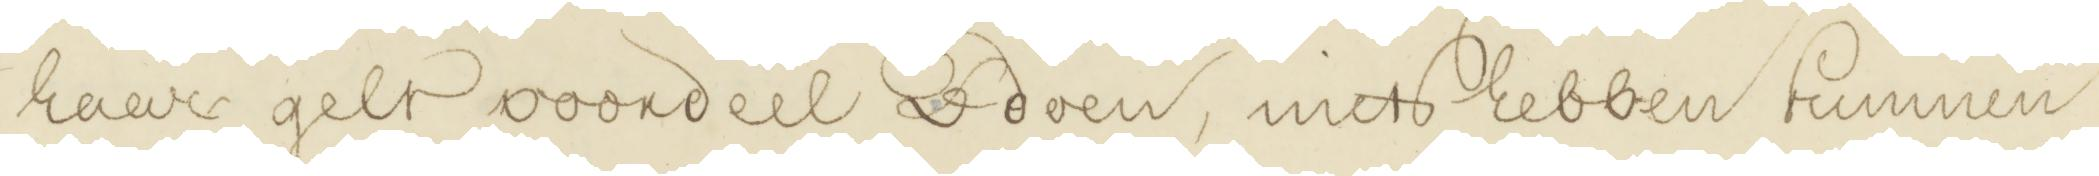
haar gelt voordeel te doen, niets hebben kunnen
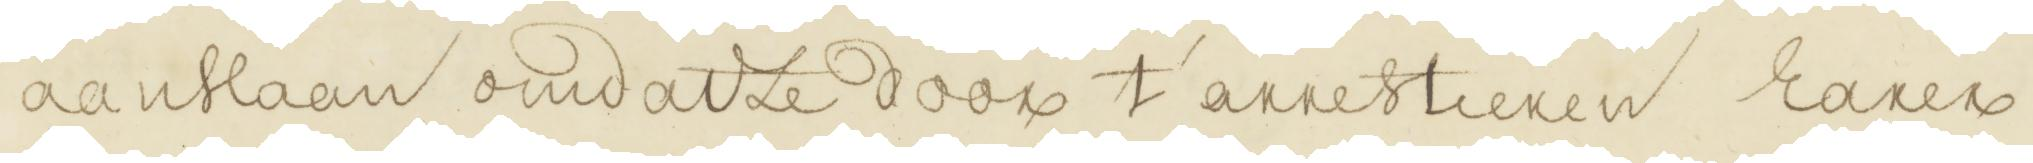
aanslaan omdatze door t' arresteeren harer
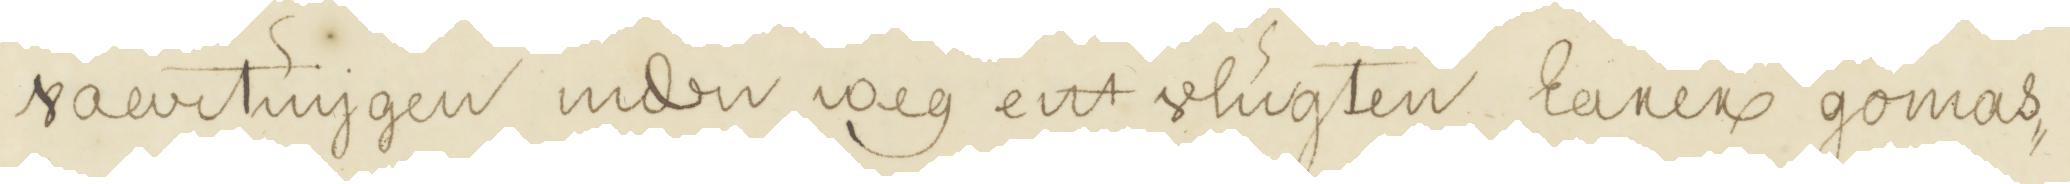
vaartuijgen inden weg ent vlugten harer gomas„
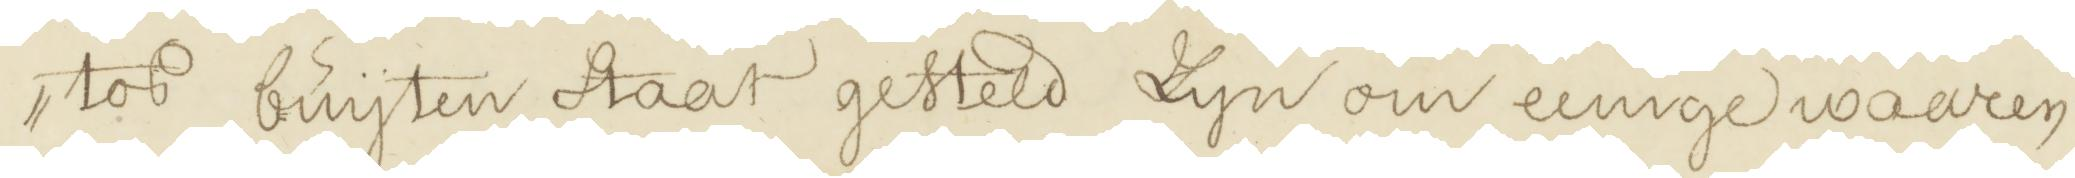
„tos buijten staat gesteld zyn om eenige waaren
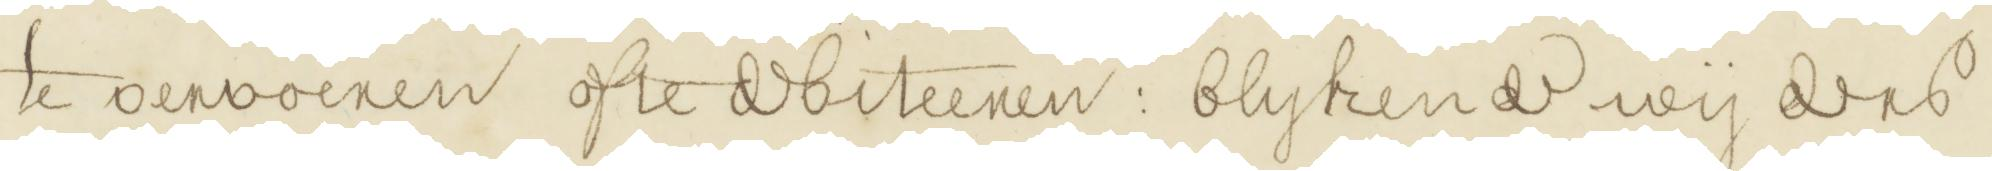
te vervoeren ofte debiteeren: blykende wij ders
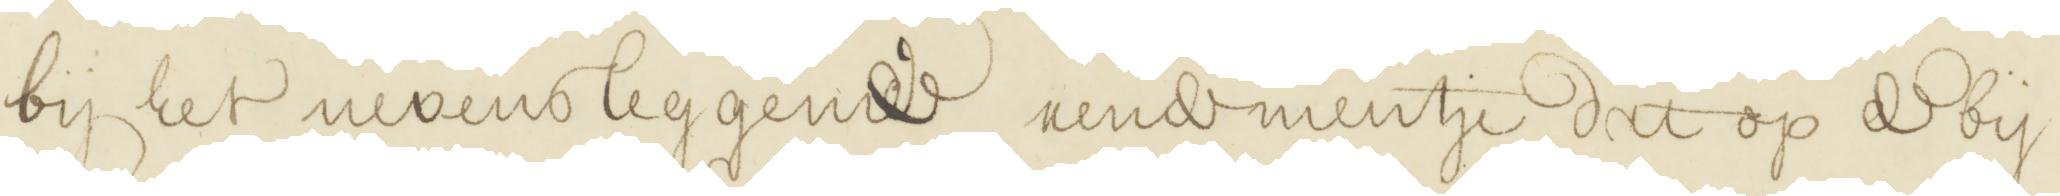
bij het nevensleggende rendementje dat op de bij
